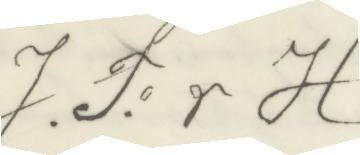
J.F. v H
